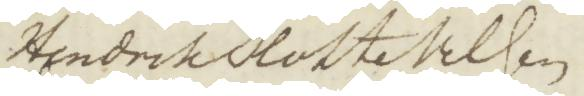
Hendrik Slot te Velsen
